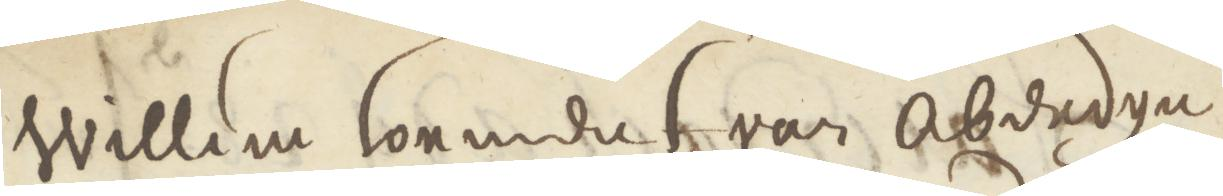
Willem torment van Aberdyn
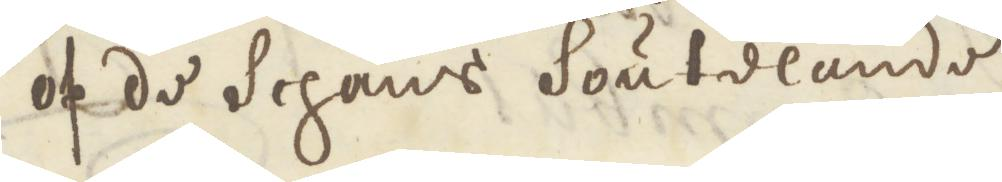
op de schans soutelande
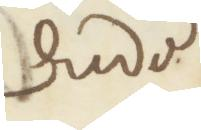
Ende:
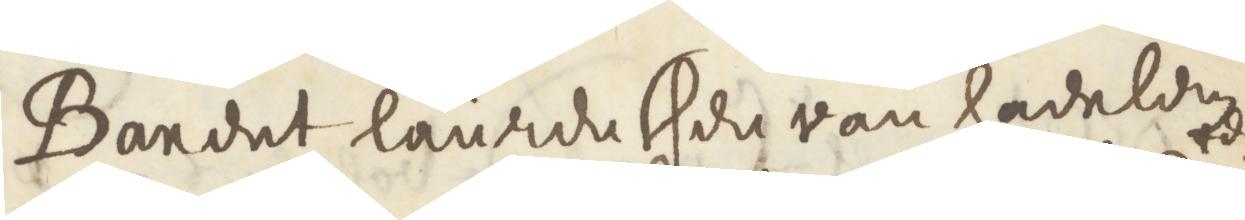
Barent laurentsen van haerlem
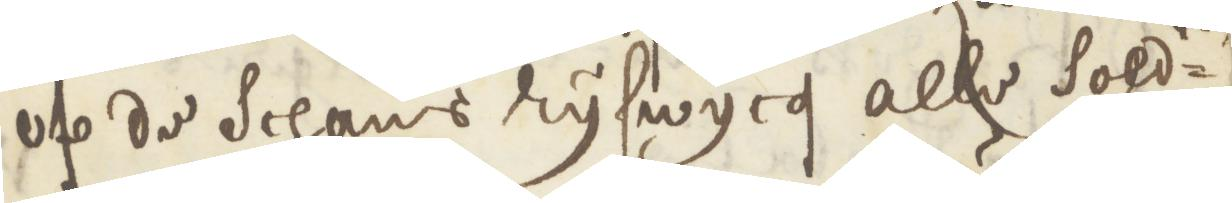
op de schans rijswijcq alle sold=ten
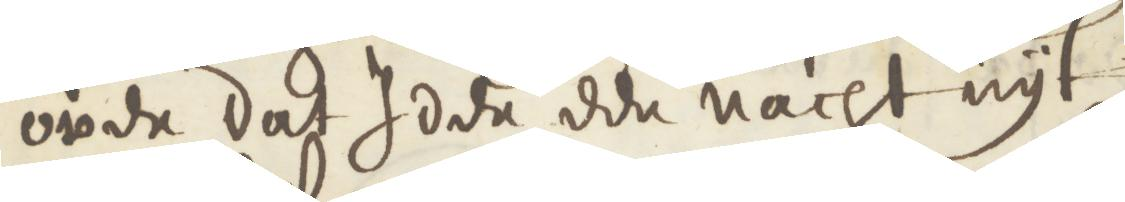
over dat Jder een nacht uijt
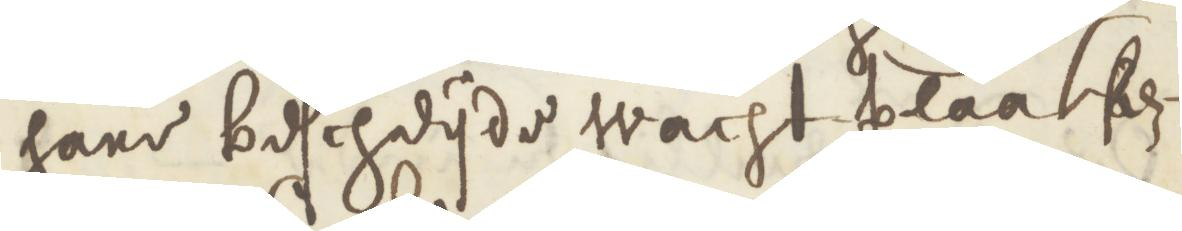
hare bescheijde wacht plaatsen
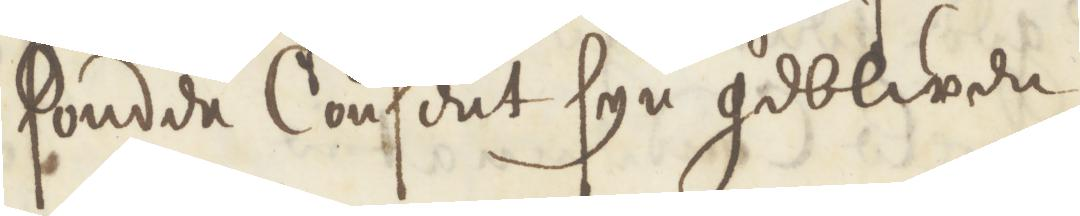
sonder Consent syn gebleven
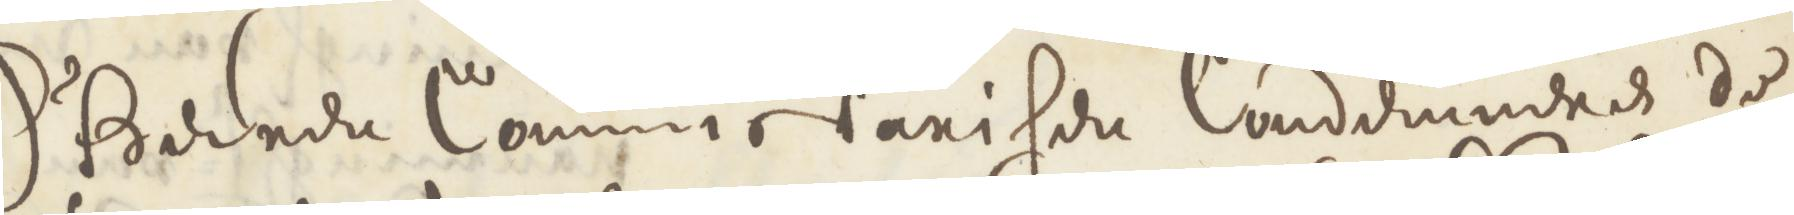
D'Heeren Commissarisen Condemneren de
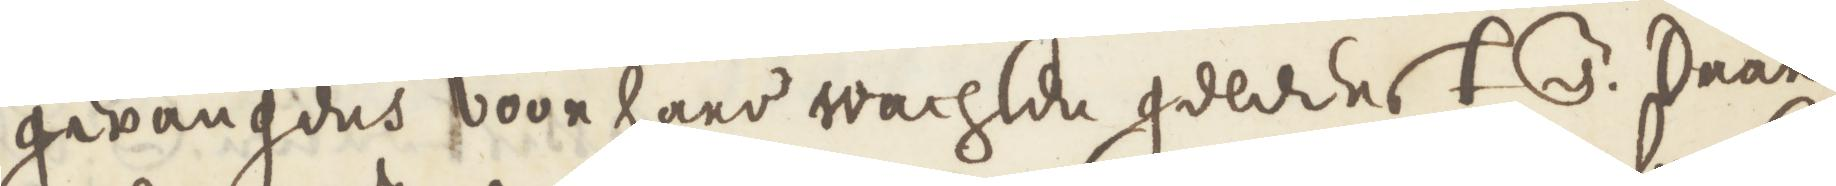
gevangens voor hare wachten geleerst ende. Daar
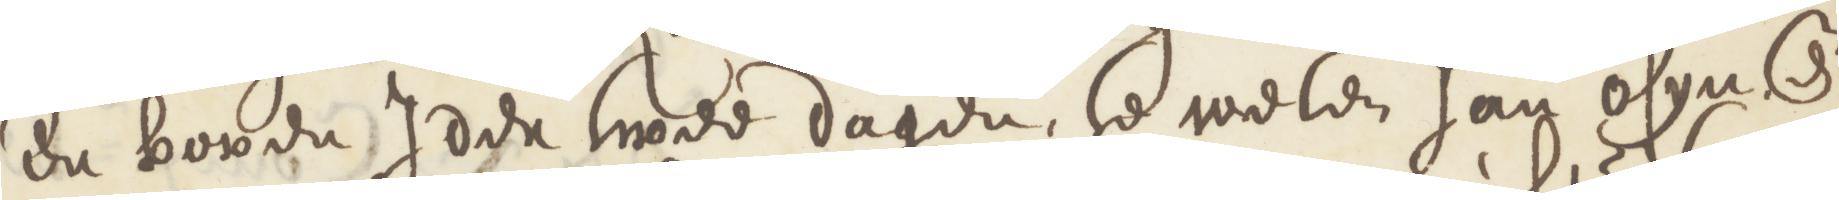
en boven Jder twee dagen, te weten Jan osyn. ende
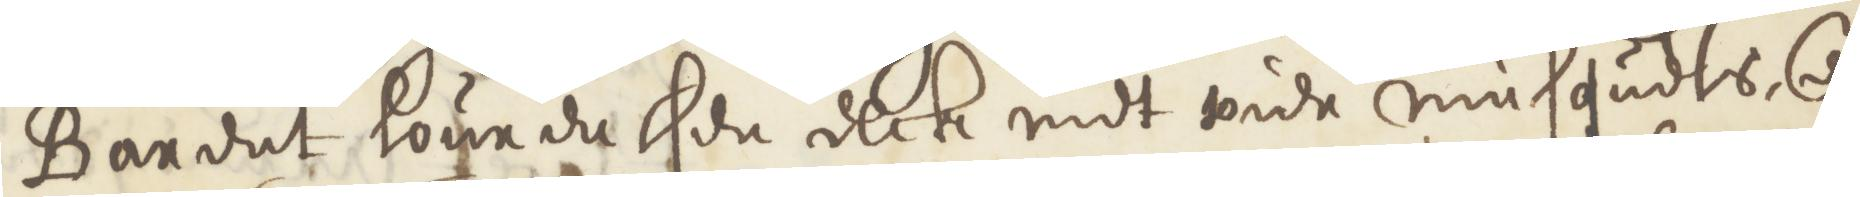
Barent lour en tsen elck met vier musquets . ende
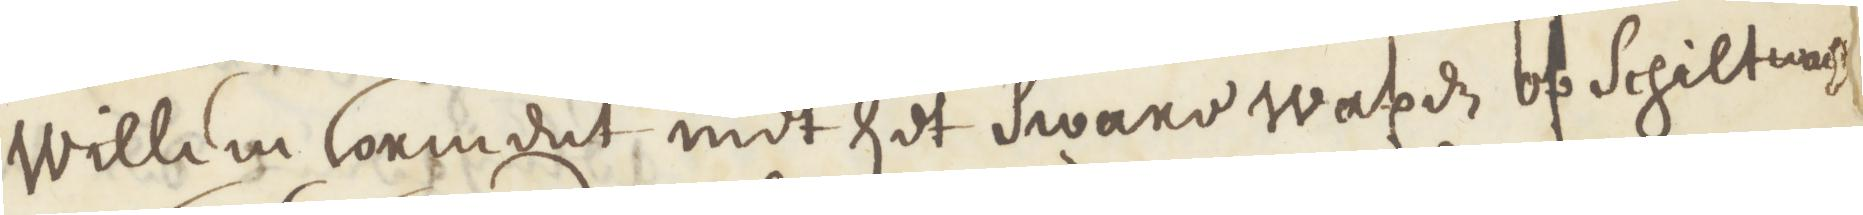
Willem torment met het sware wapen op schiltwa
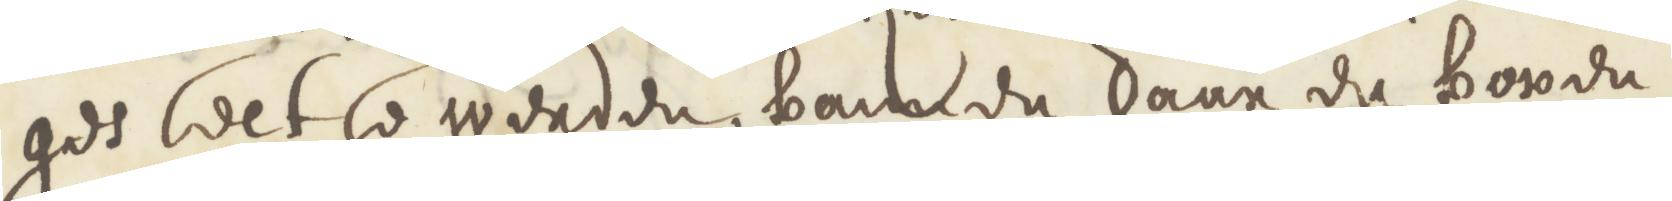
ges telt te werden bannen daar en boven
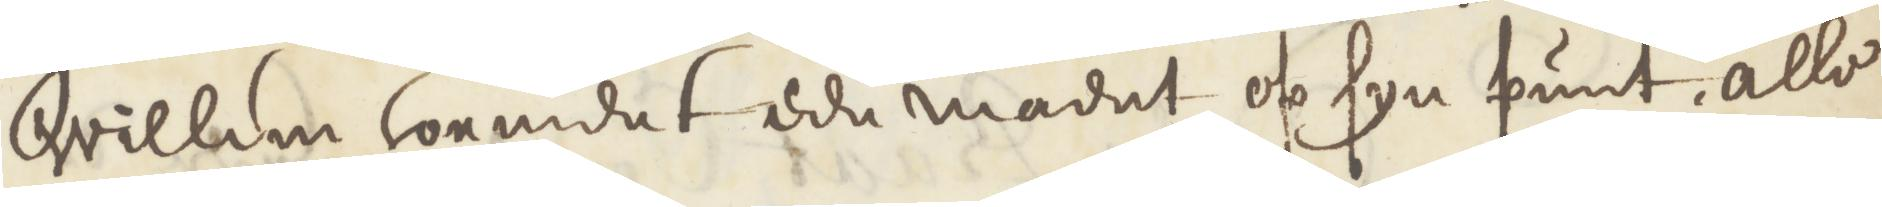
Willem torment een maent op syn punt, alle
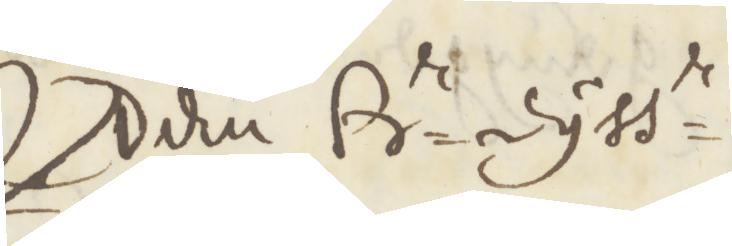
den H=r Eijss=r
